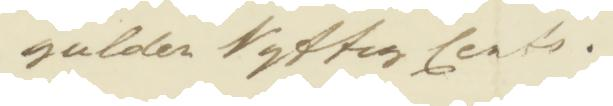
gulden Vyftig Cents.
